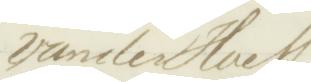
vander Hoeff
